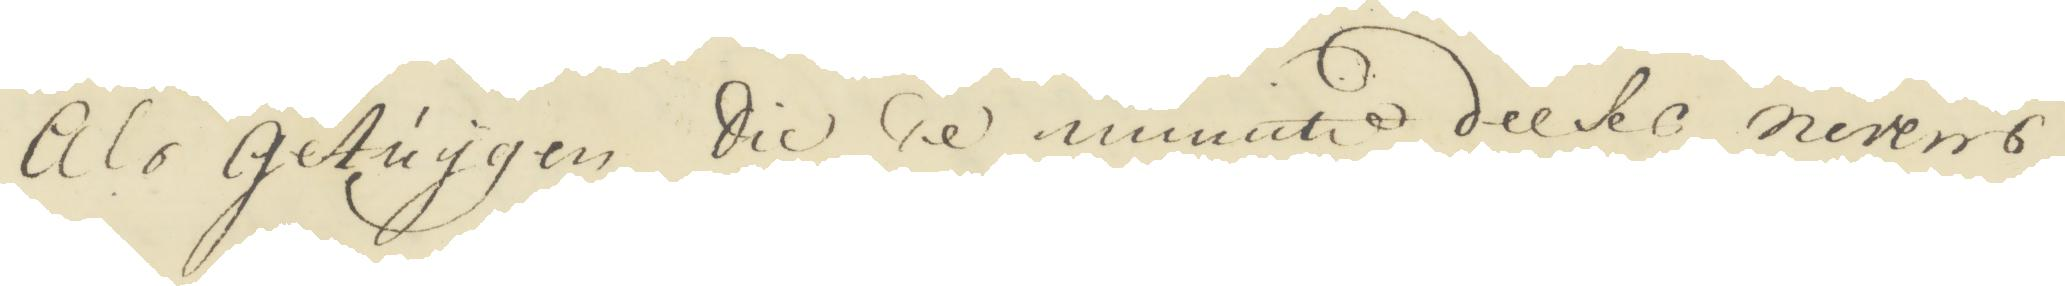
als getuijgen die de minute deeses nevens
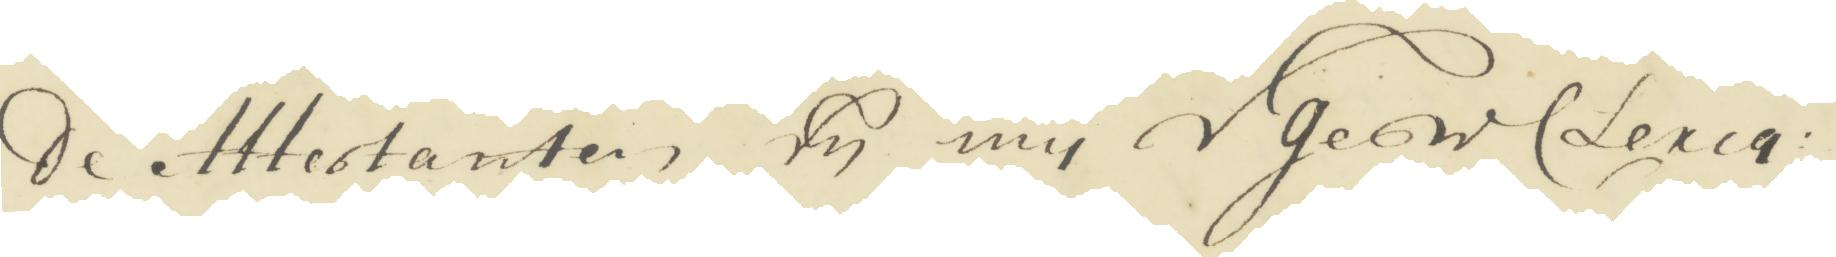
de Attestanten En mij v gesw Clercq:
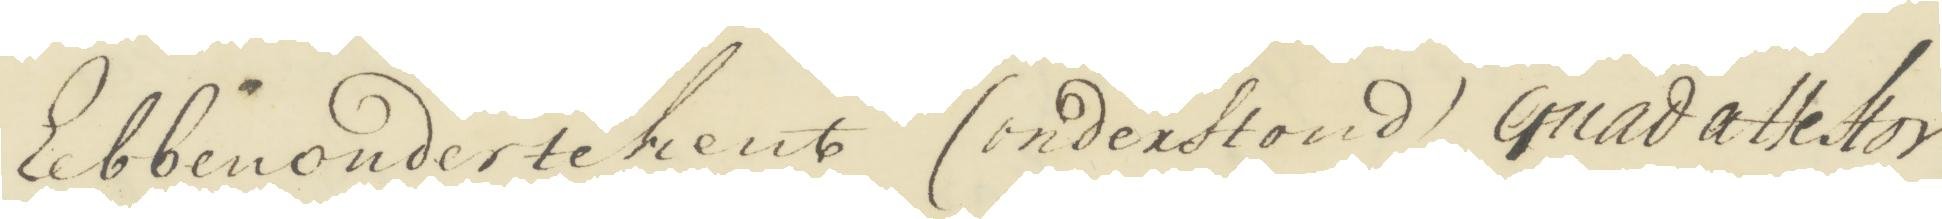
hebben ondertekent (onderstond) quad attestor
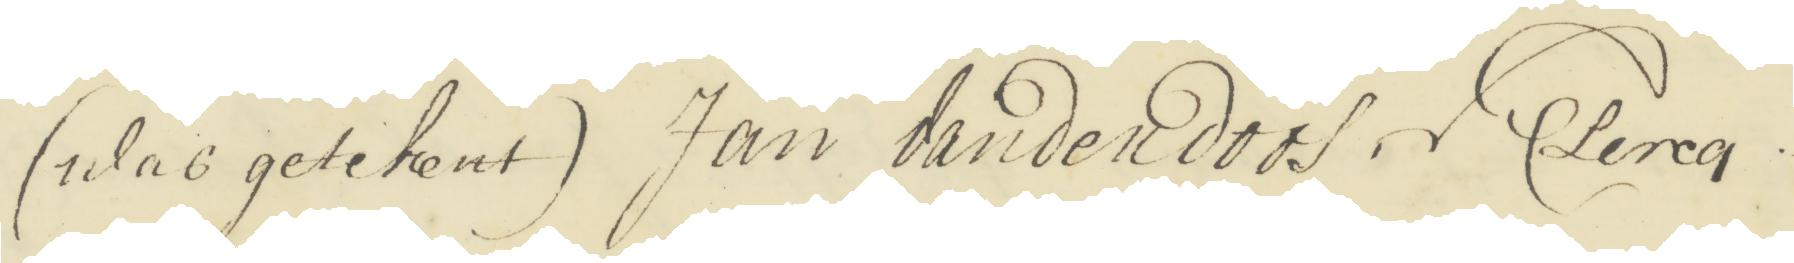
(was getekent) Jan van der doos EClercq
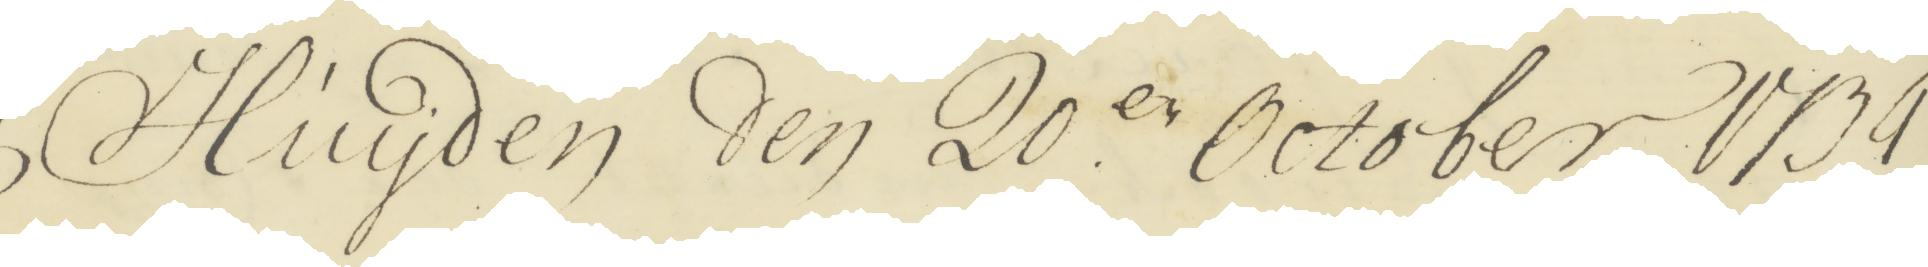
OP Huijden den 20.en October 1734
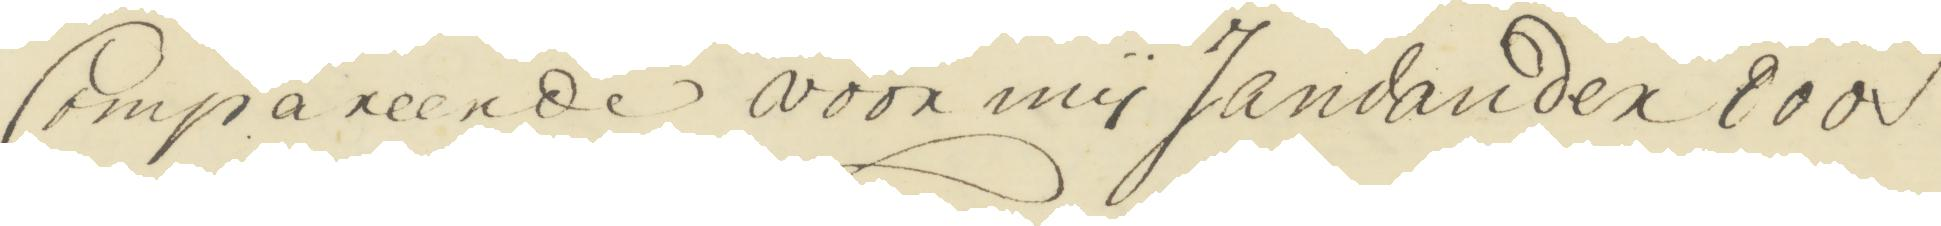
Compareerde voor mij Jan van der doos
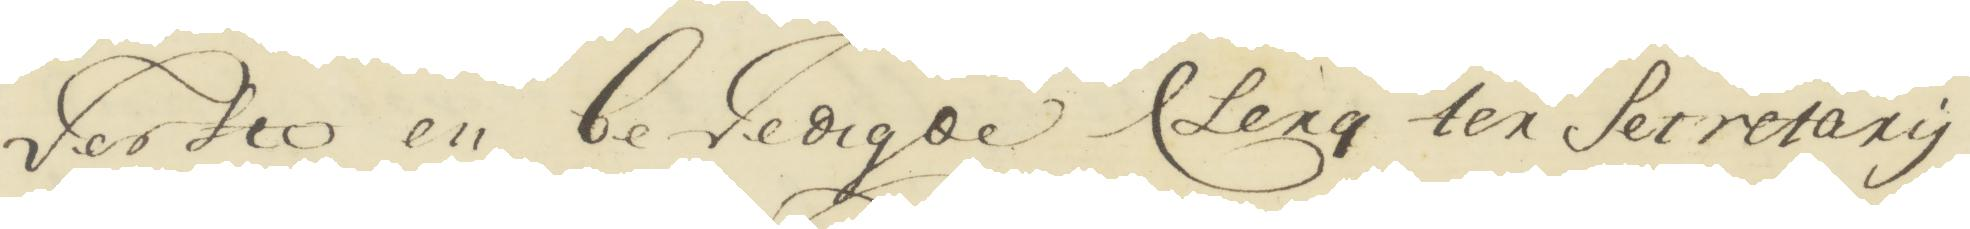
Eerste en beEedigde Clerq ter secretarij
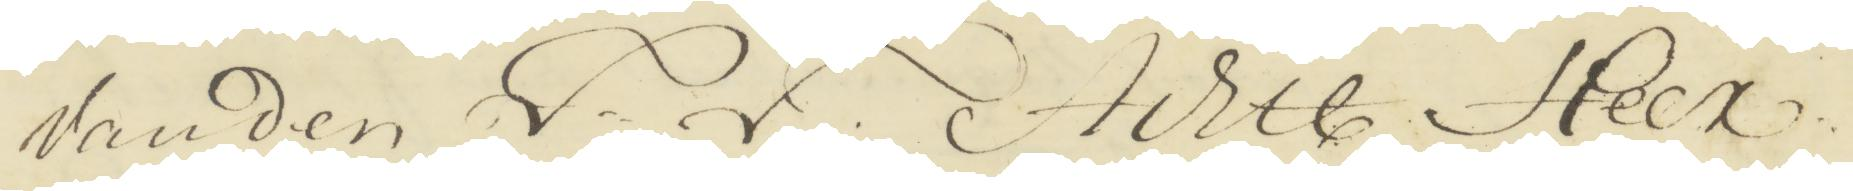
van den E: E. Achtb Heer
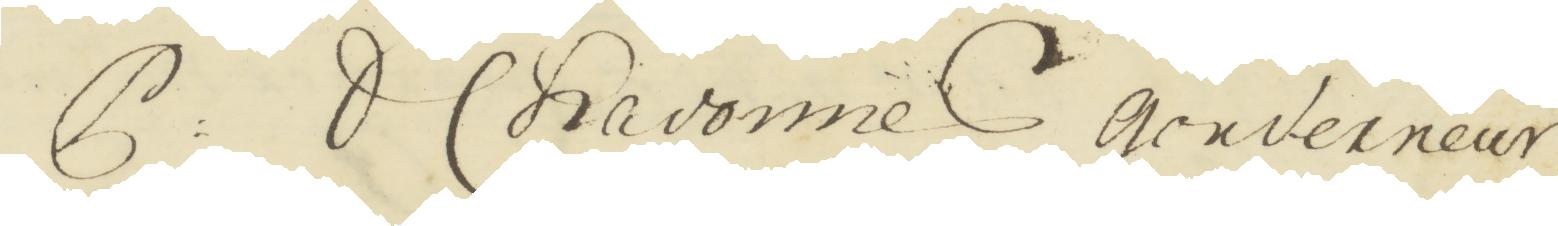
P: R: P: de Chavonnes gouverneur
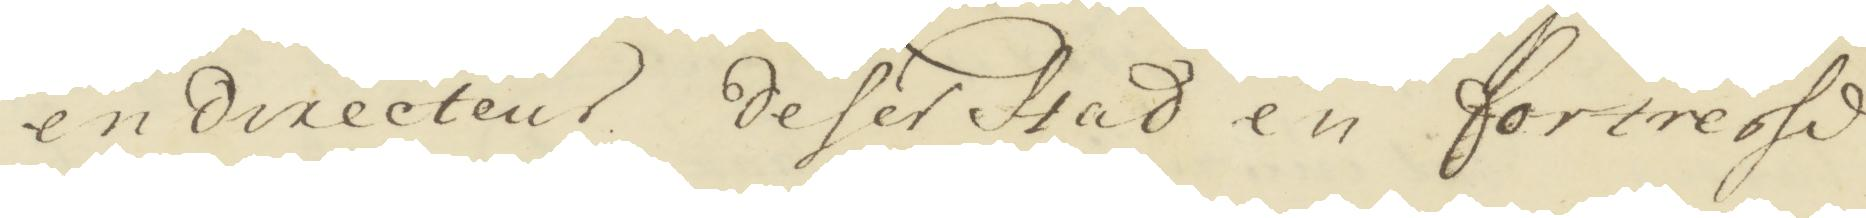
en directeur. deser stad en fortresse
